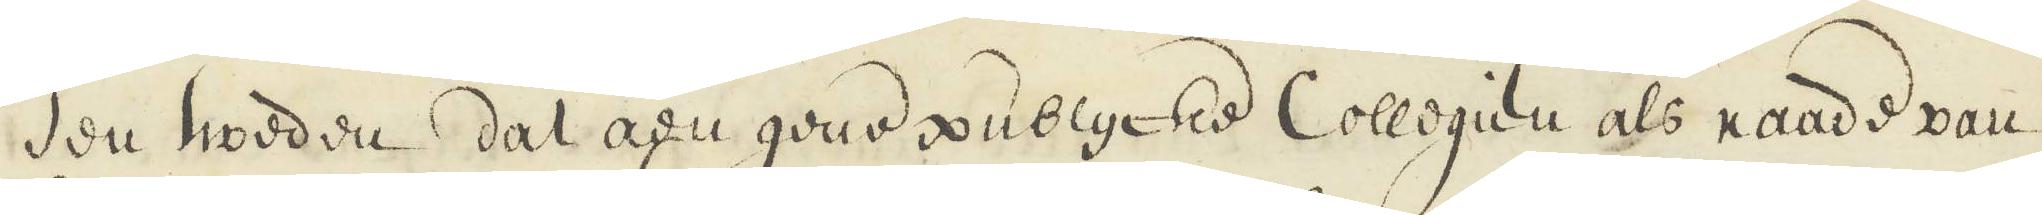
Ten tweden dat aen gene publycke Collegien als raade van
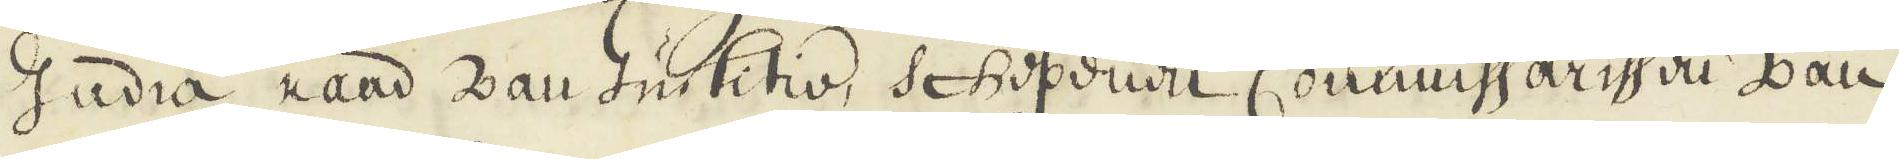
Jndia raad van Iustitie, schepenen Commissarissen van
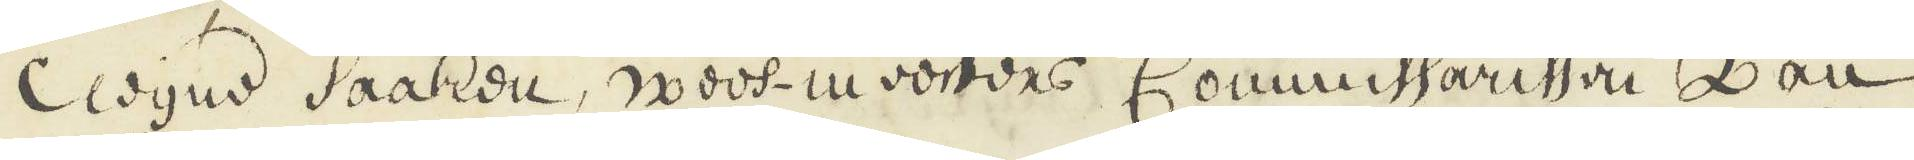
Cleijne saaken, weesmeesters Commissarissen van
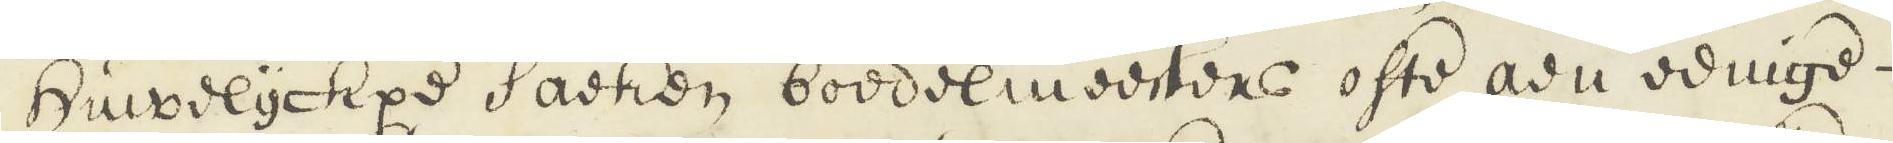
huwelijckxe saeken boedelmeesters ofte aen eenige
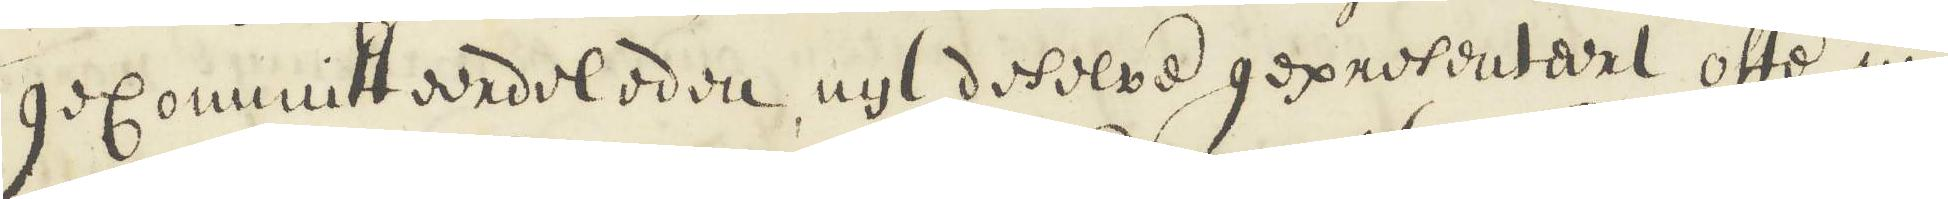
gecommitteerde leden, uyt deselve gepresenteert ofte in
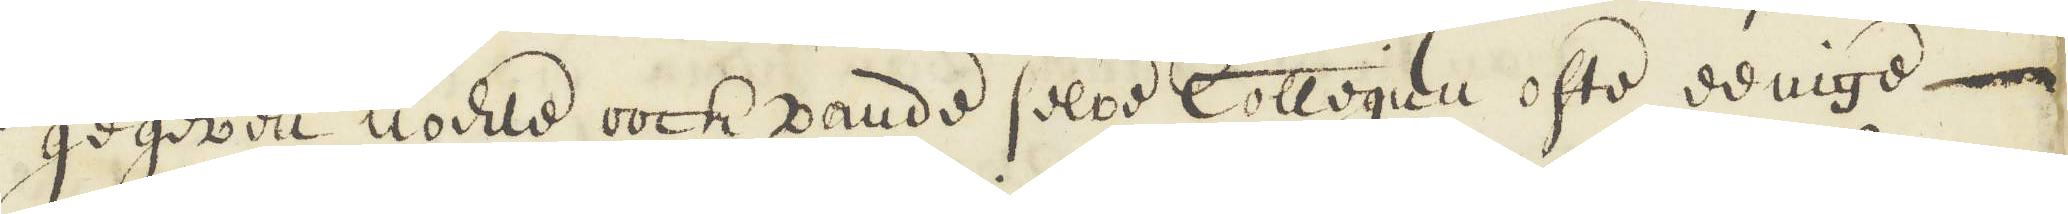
gegeven nochte oock vande selve Collegien ofte eenige —
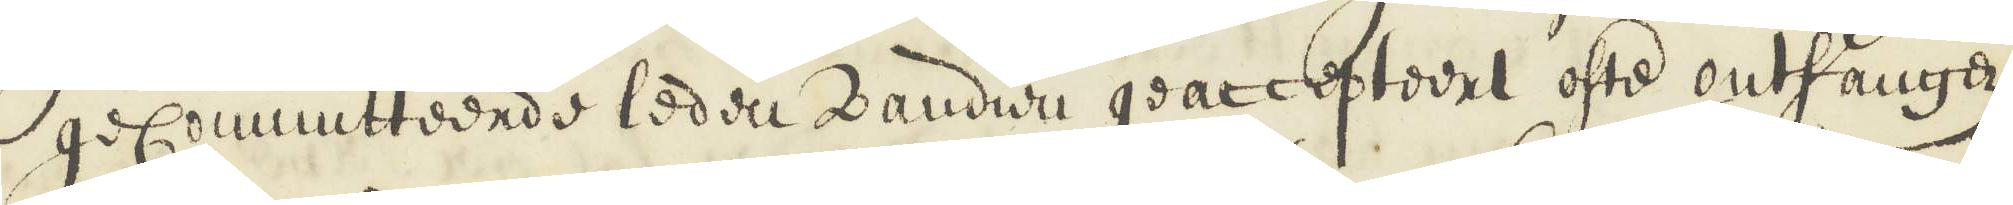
gecommitteerde leden vandien geaccepteert ofte ontfangen
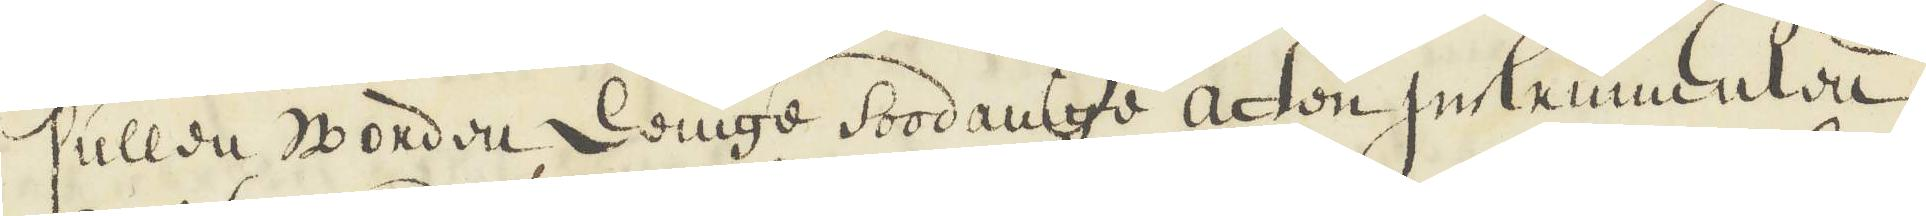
sullen worden Eenige soodanige acten jnstrumenten
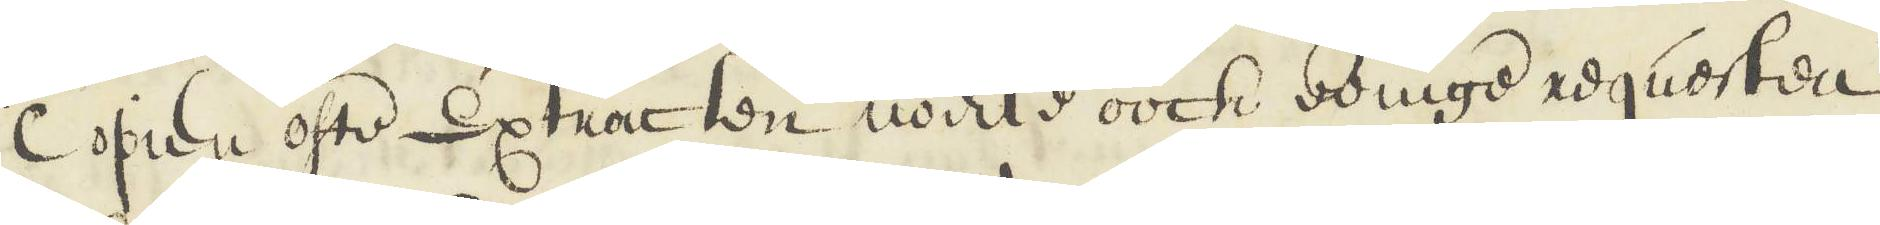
Copien ofte Extracten nochte oock eenige requesten
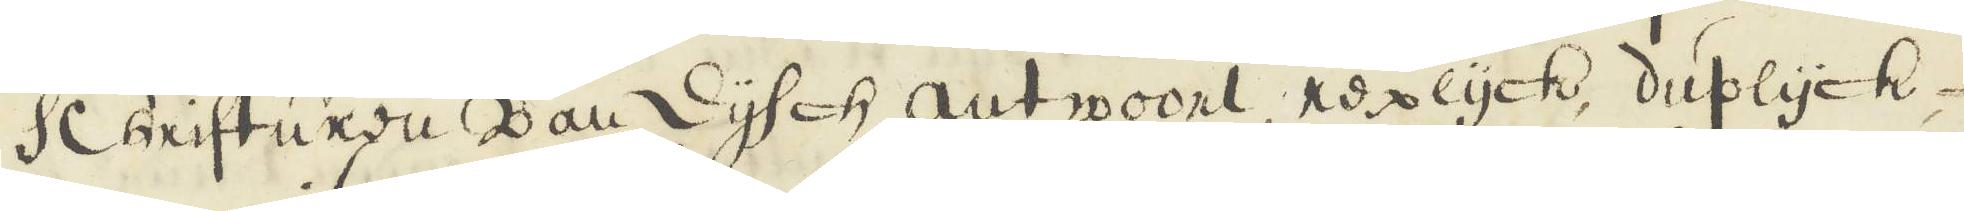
schrifturen van Eijsch Antwoort, replijck, duplijck,
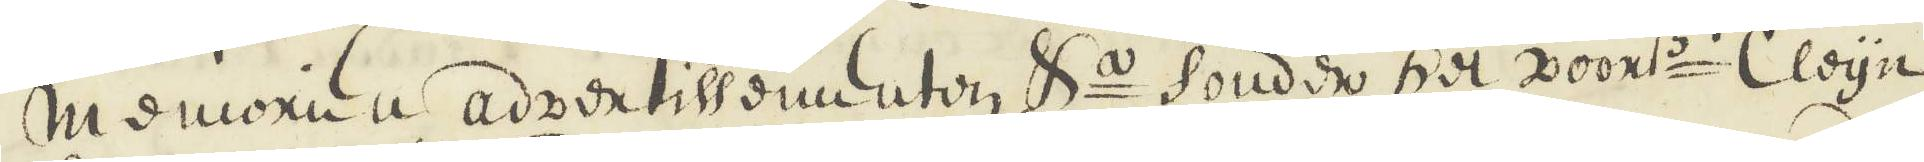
Memorien, advertissementen &=a sonder het voors=z Cleijn
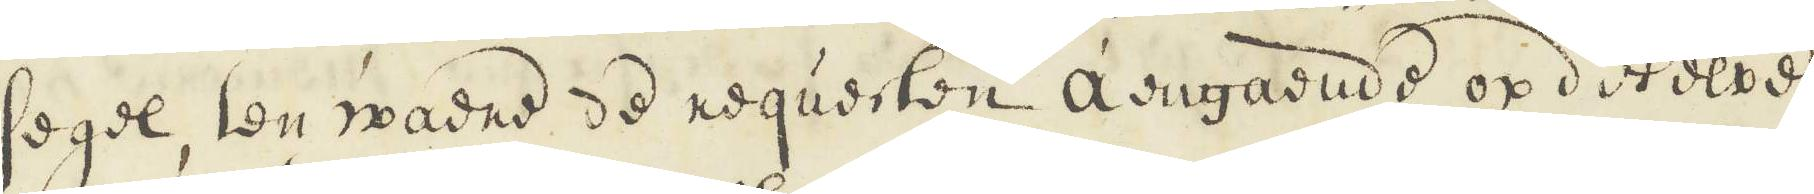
segel, ten waere de requesten aengaende op deselve
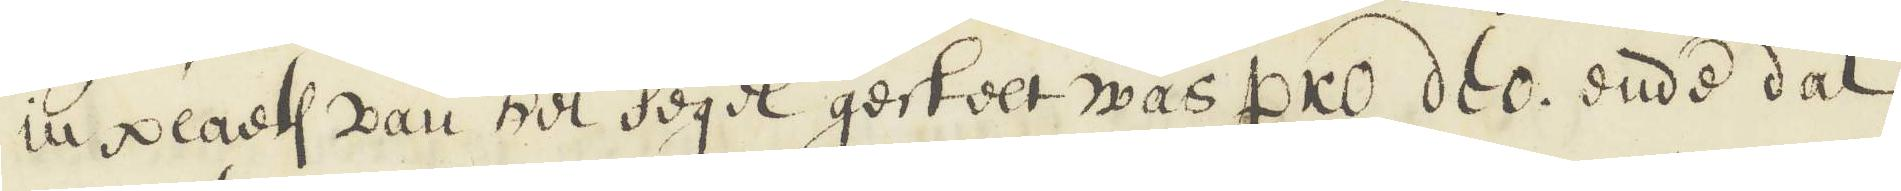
in plaets van het segel gestelt was pro deo. ende dat
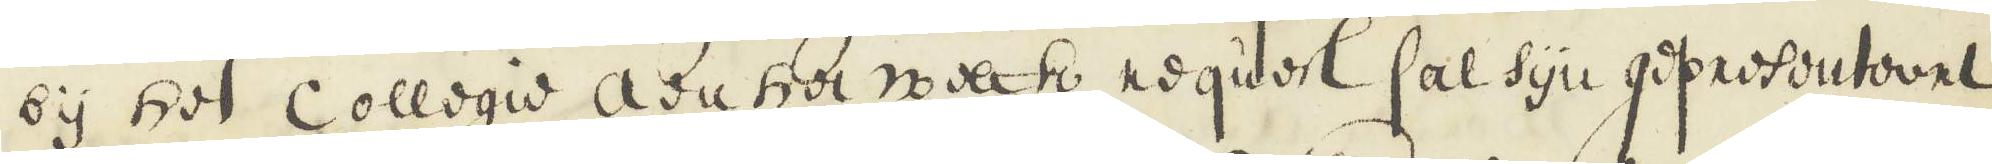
bij het Collegie aen het welck request sal sijn gepresenteert
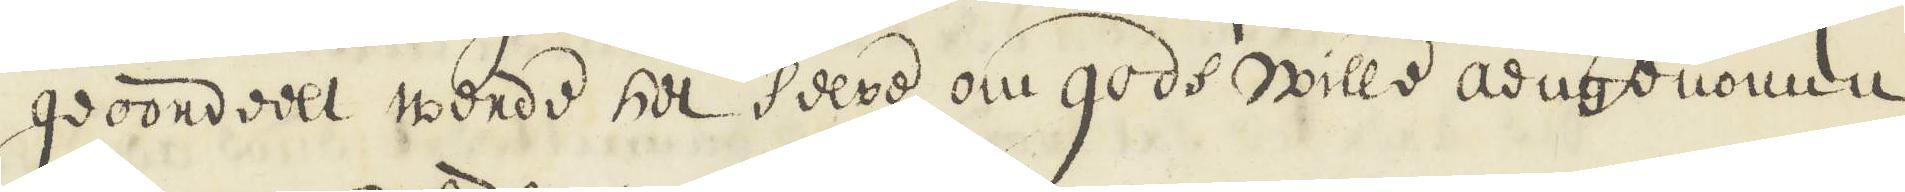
geoordeelt werde het selve om gods wille aengenomen
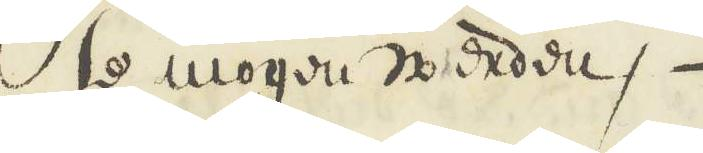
te mogen werden/ -
